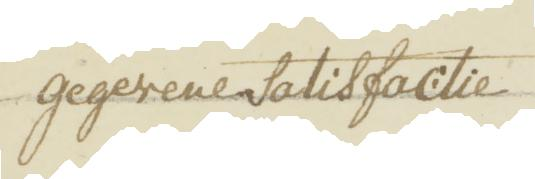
gegevene satisfactie
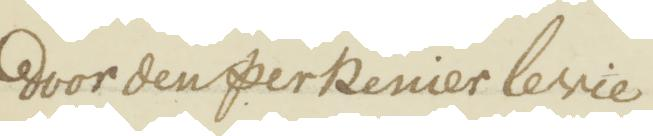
door den perkenier levie
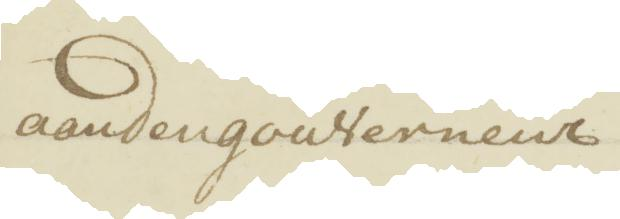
aan den gouverneur
